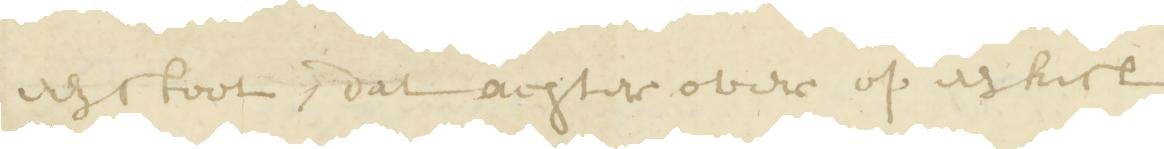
een stoot, dat achter over op een kist
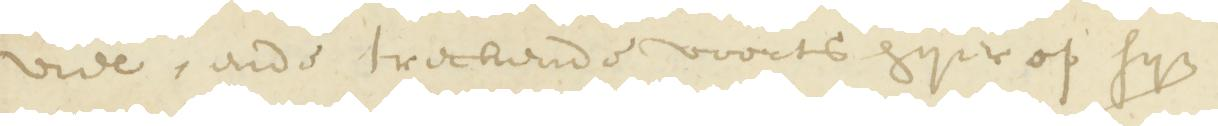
viel, ende treckende voorts hyer op syn
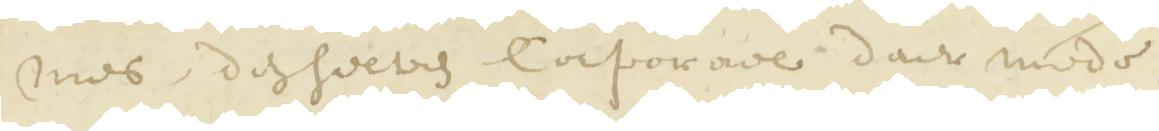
mes, denselven Corporael daer mede
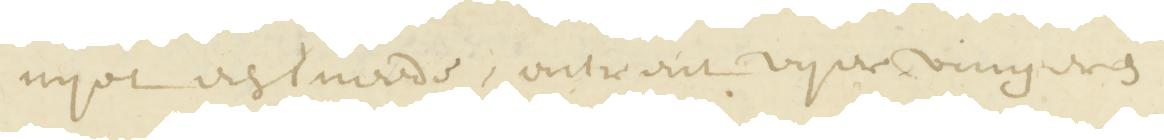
nyet eensneede, ontrent vyer vingeren
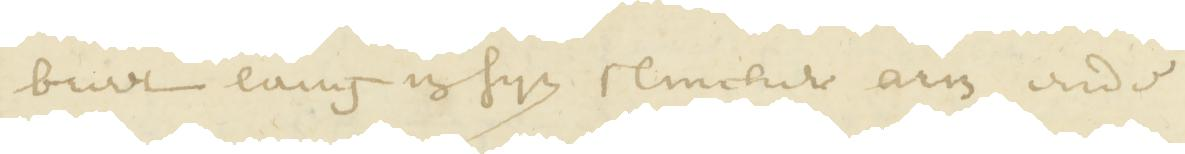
breet lang in syn slincker arm ende
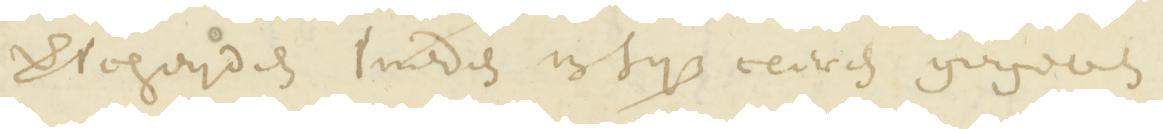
verscheyden sneden in syn cleren gegeven
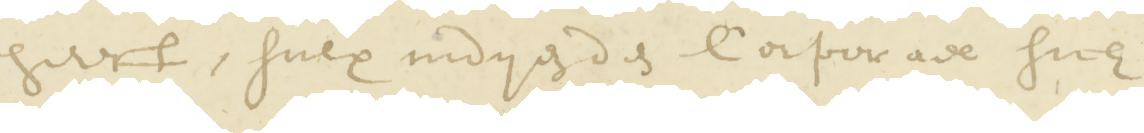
heeft, sulx indyen den Corperael sich
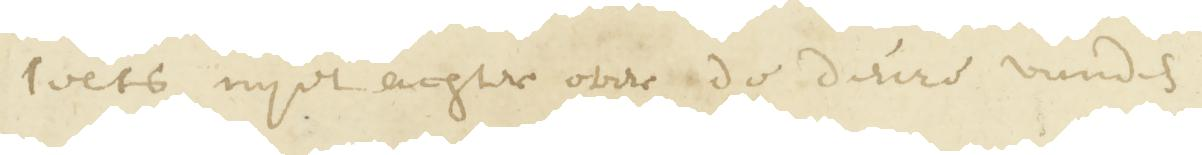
selfs nyet achter over de deure vanden
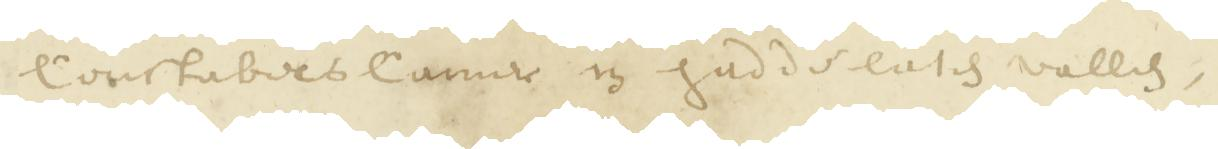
Constabels Camer in hadde laten vallen,
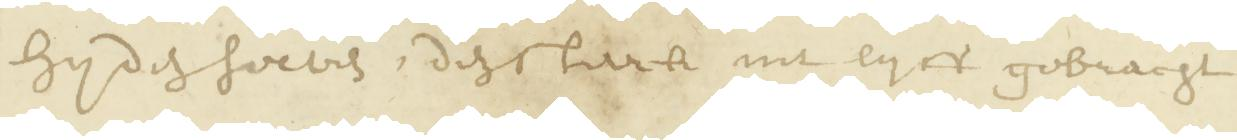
hij den selven, densteeck int lyff gebracht
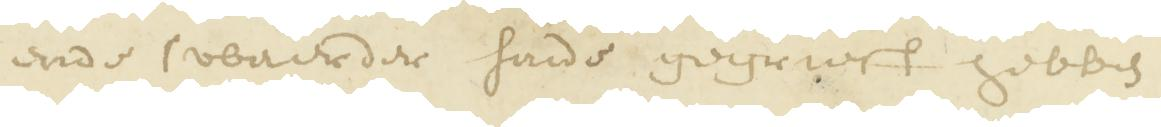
ende swaerder soude gegrieft hebben
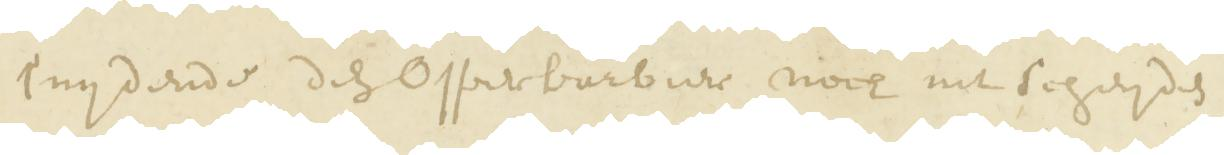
snydende den Opperbarbier noch int scheyden
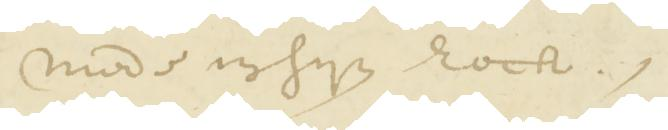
mede in syn rock./
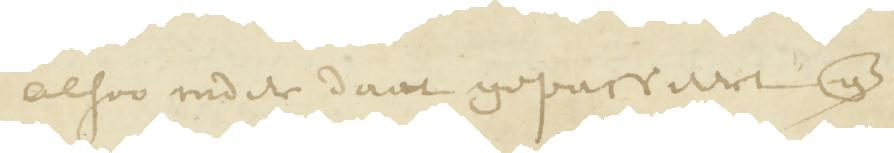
alsoo inder daat gepasseert ende
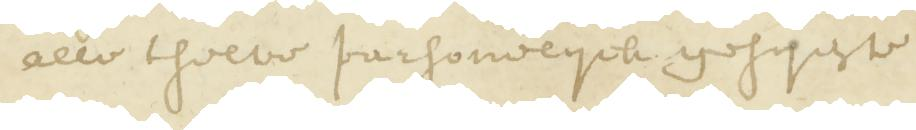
alle tselve parsonelijck gesychte
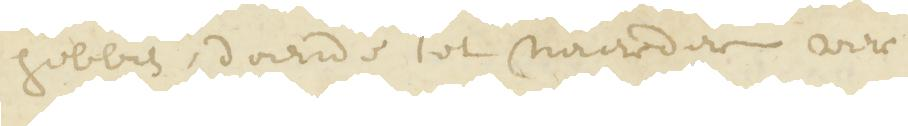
hebben, doende tot naerder ver
